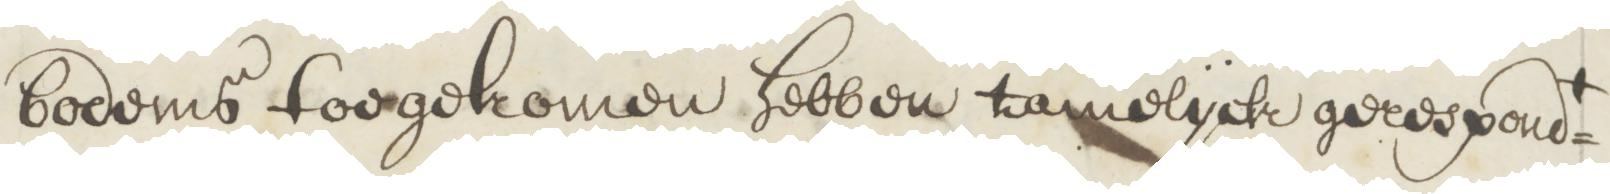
bodems toegekomen hebben tamelijck gerespond=t
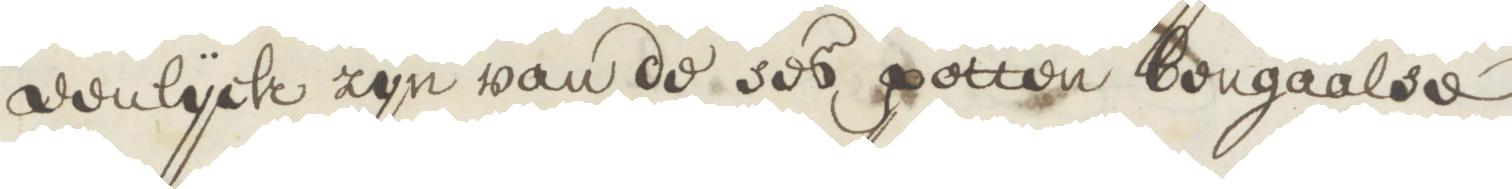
eenlijck zijn van de ses potten bengaalse
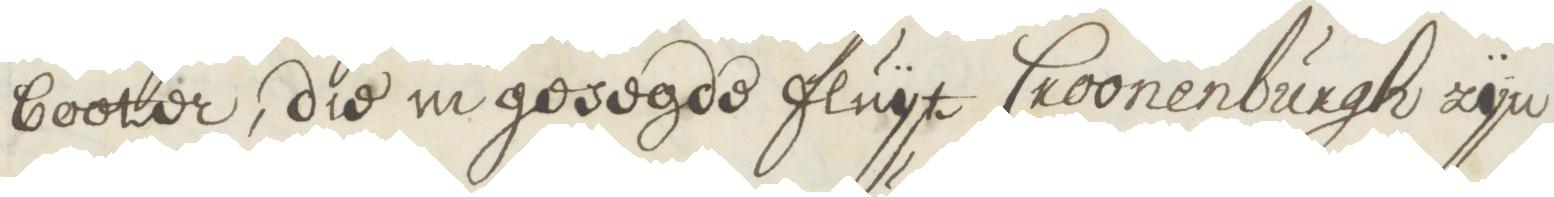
booter, die in gosegde fluijt Croonenburgh zijn
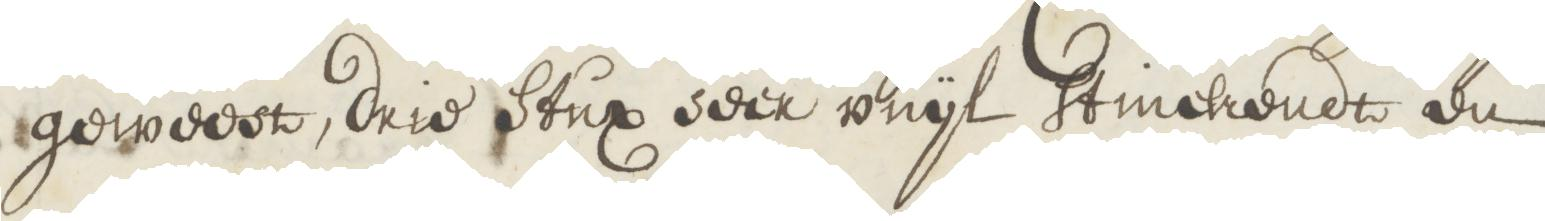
geweest, drie stux seer vuijl stinckendt en
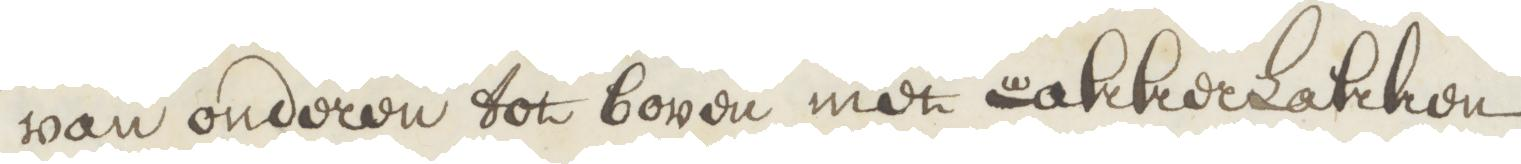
van onderen tot boven met cakkerlakken
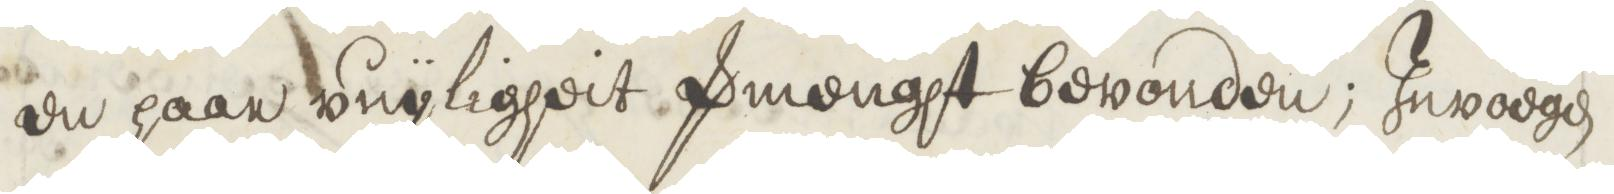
en haar vuijligheit vermenght bevonden; Jnvoegen
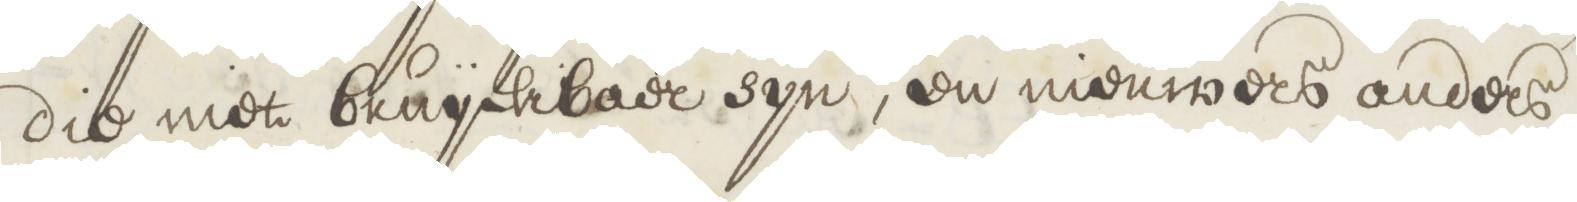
die niet bruijckbaer sijn, en nieuwers anders
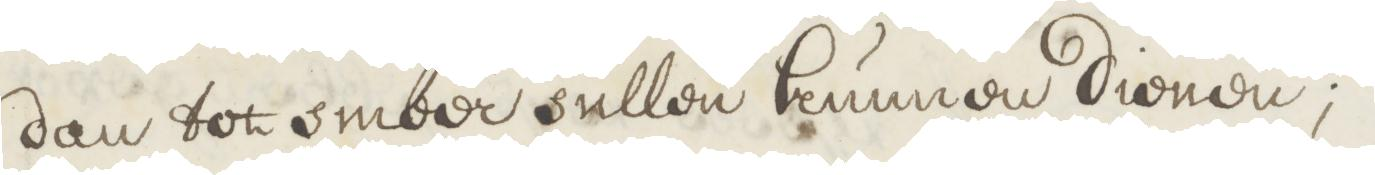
dan tot smeer sullen kunnen dienen;
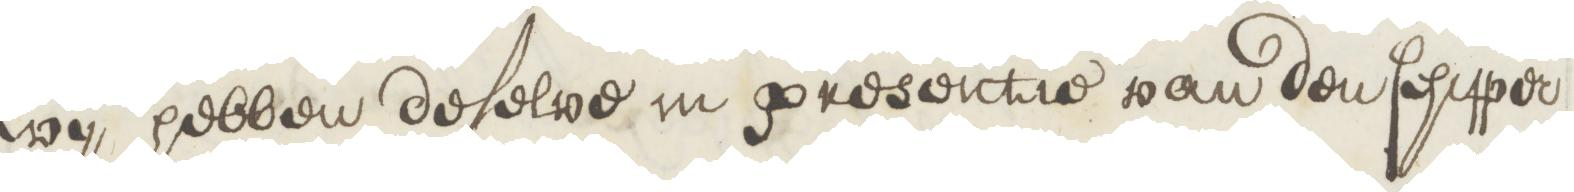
wij hebben deselve in presentie van den schipper
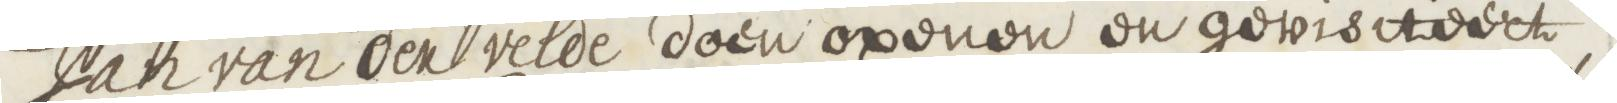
Jan van der velde doen openen en gevisiteert,
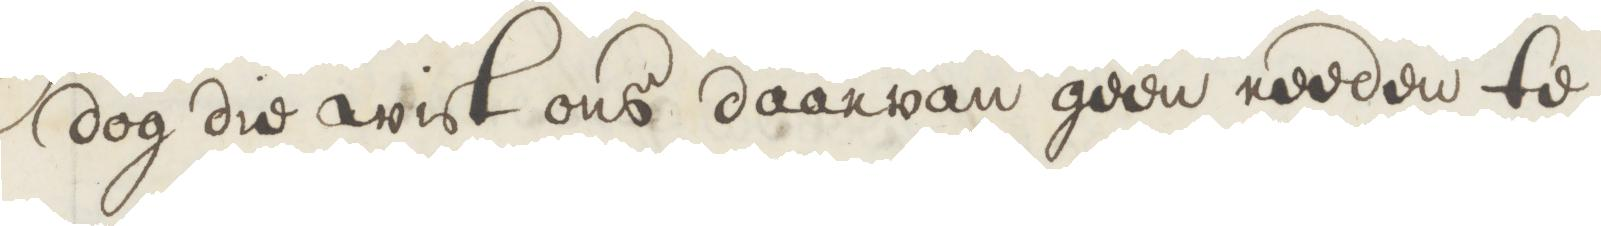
dog die wist ons daarvan geen reeden te
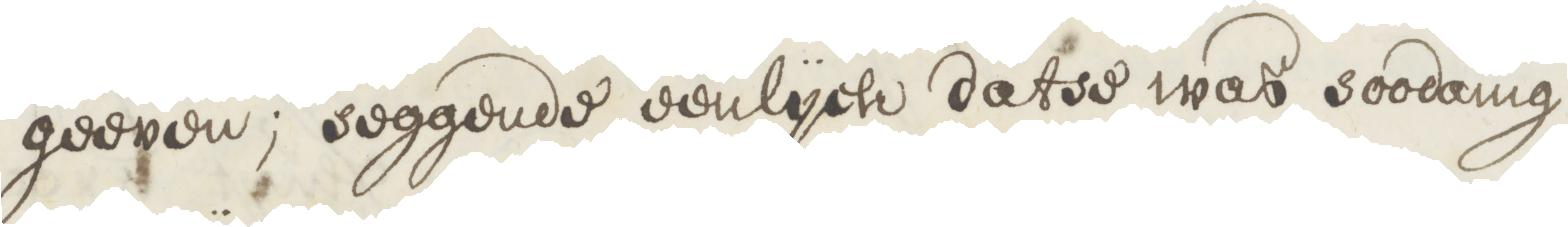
geeven; seggende eenlijck datse was soodanig
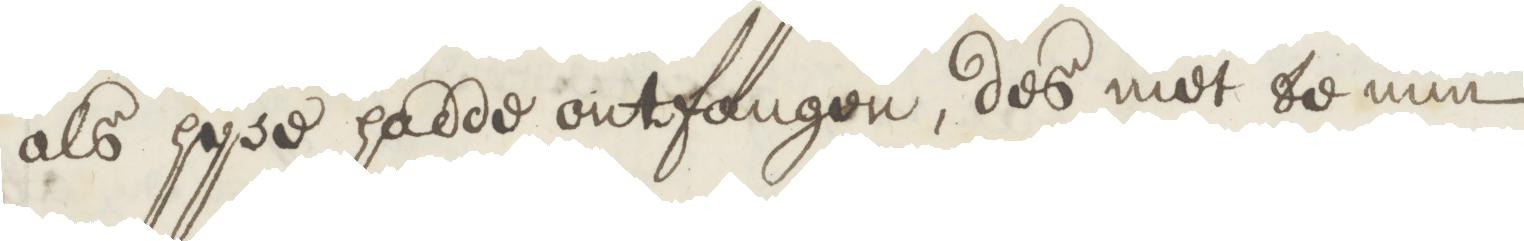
als hijse hadde ontfangen, des niet te min
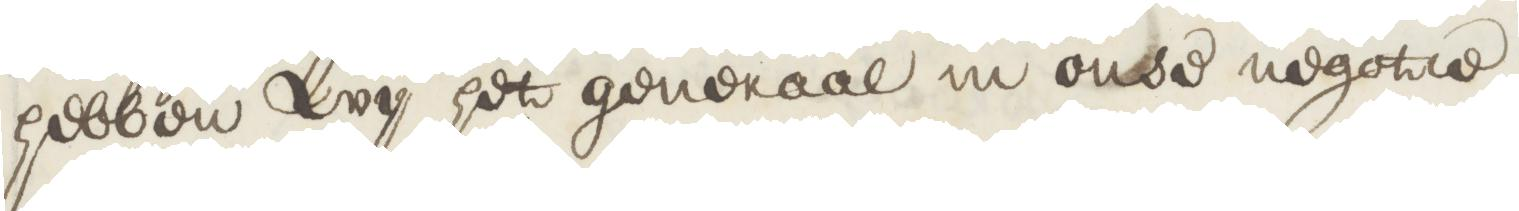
hebben wij het generaal in onse negotie
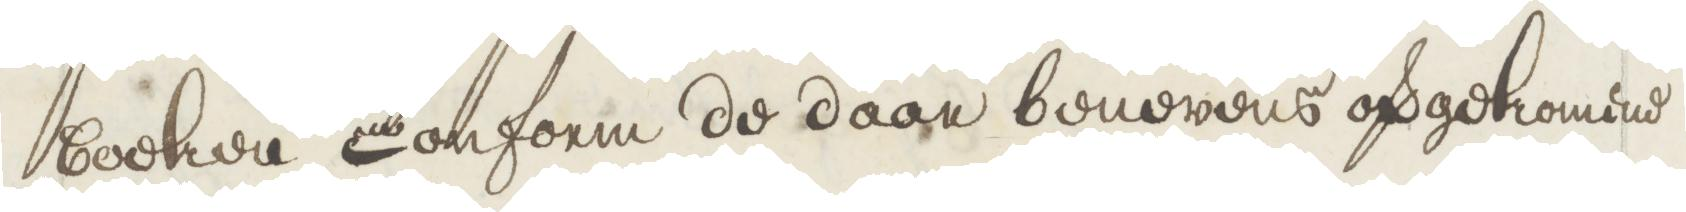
boeken conform de daar benevens overgekomene
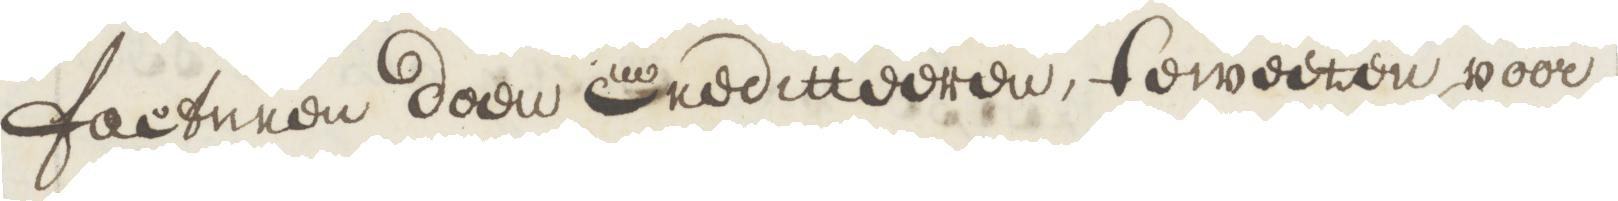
facturen doen Creditteeren, teweeten voor
